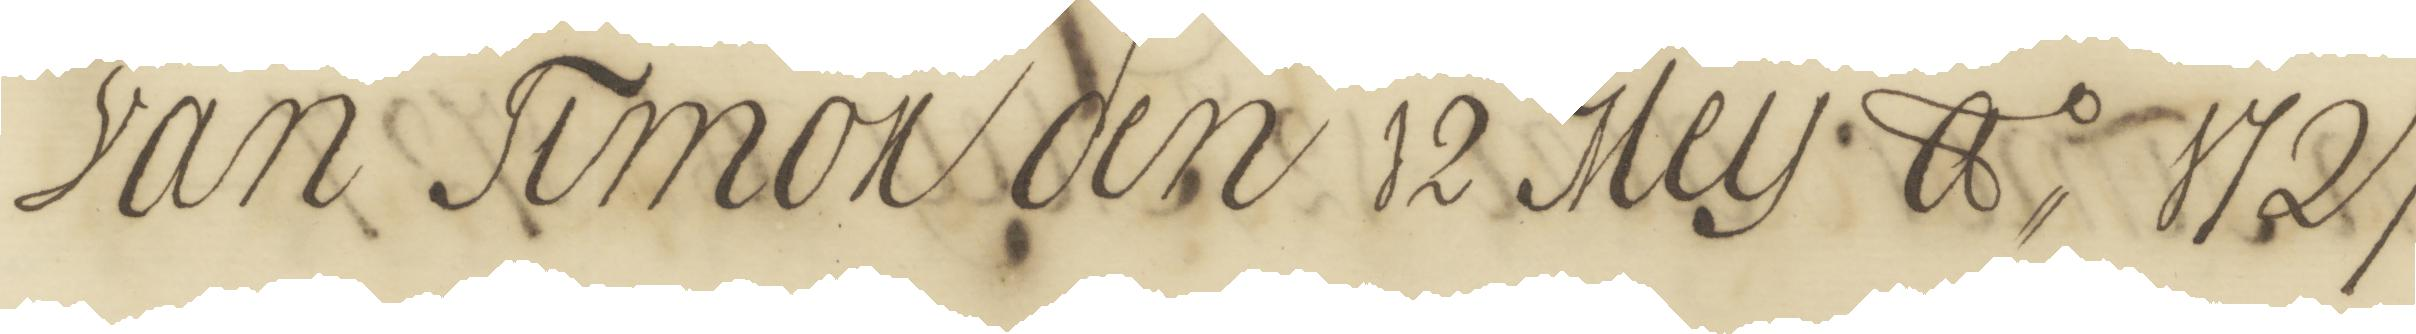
van timor den 12 meij A„o 1727
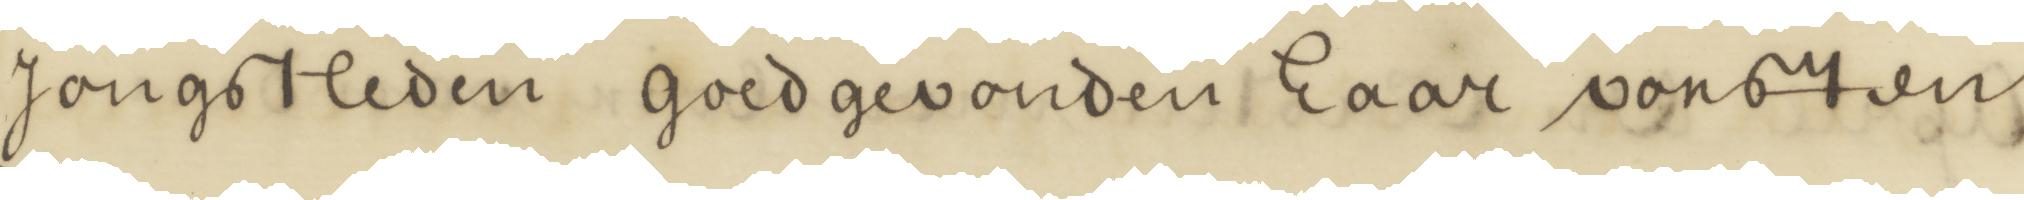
Jongstleden goedgevonden haar vorsten
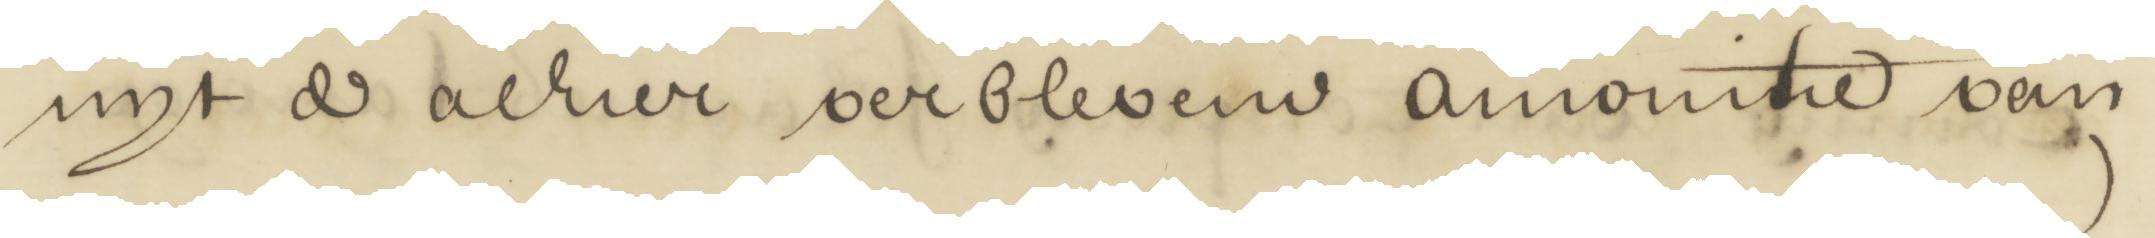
uijt de alhier verblevene amonitie van
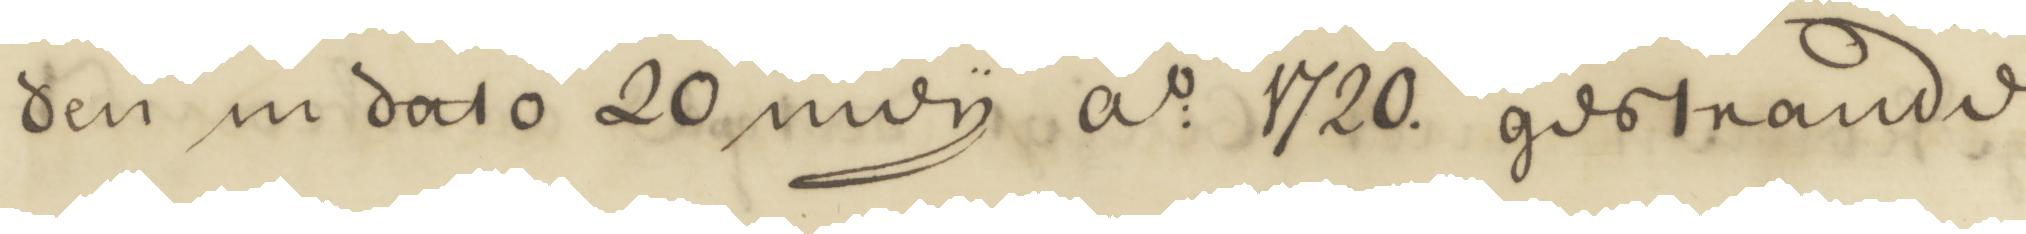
den in dato 20 meij a:o 1720. gestrande
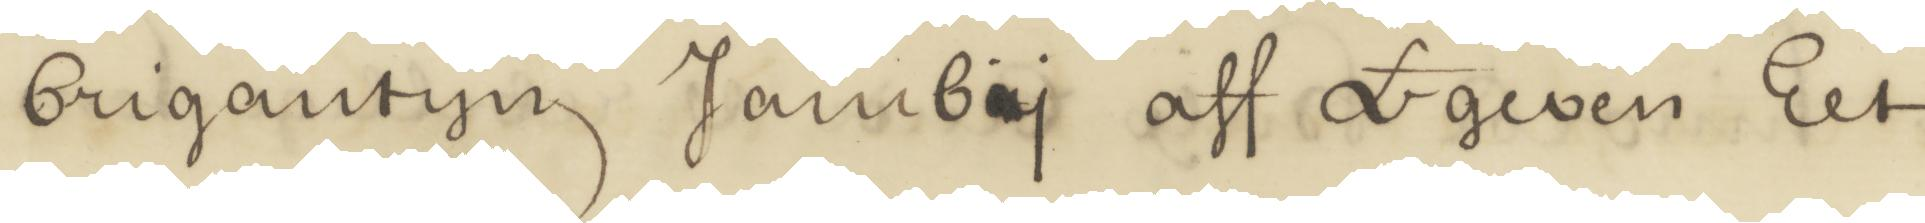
brigantijn Jambij aff te geven het
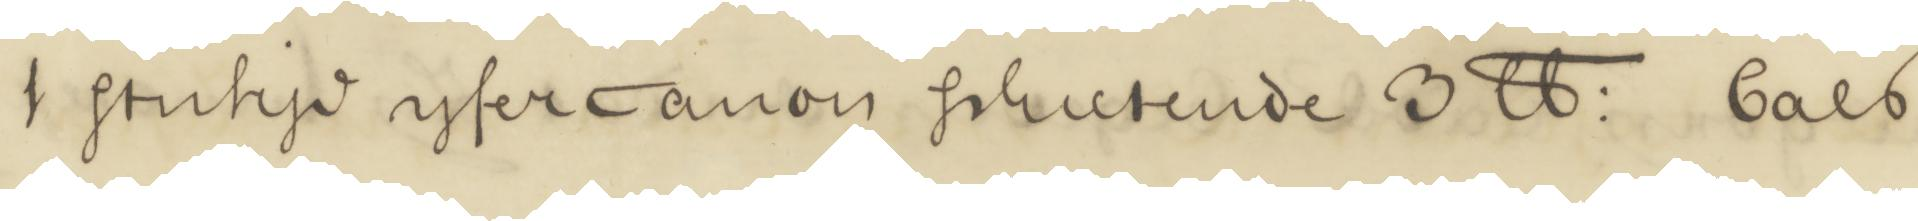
1 stukje ysercanon schietende 3 lb: bals
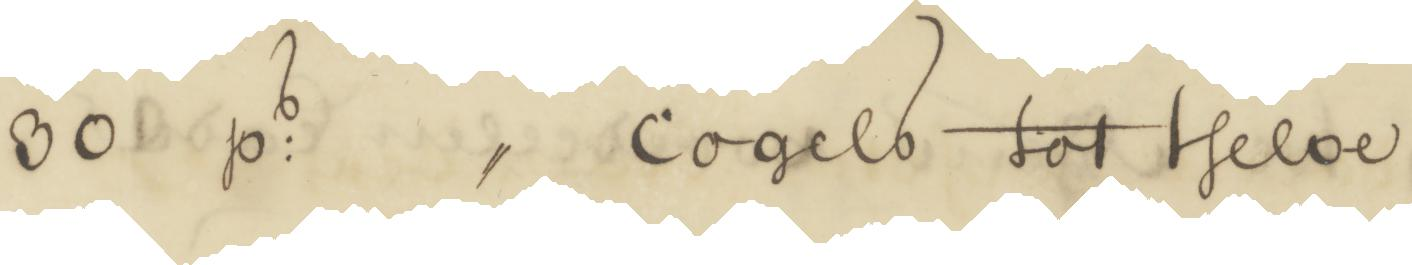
30 p:s „ cogels tot tselve
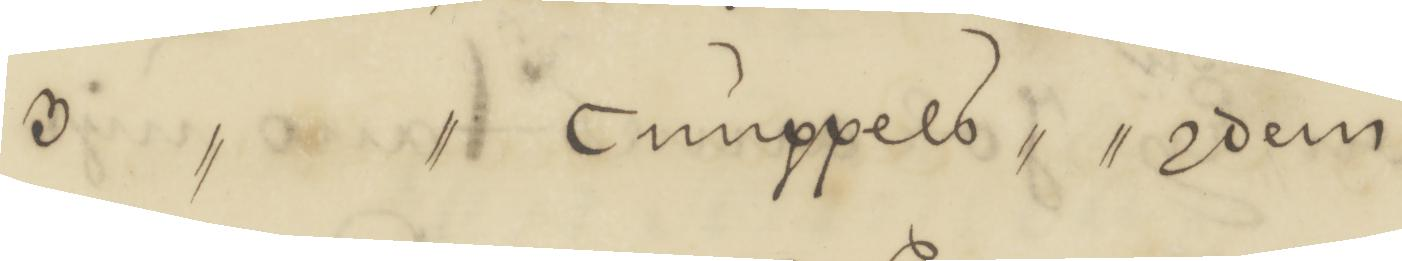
3 „ „ Cnuppels „ „ jdem
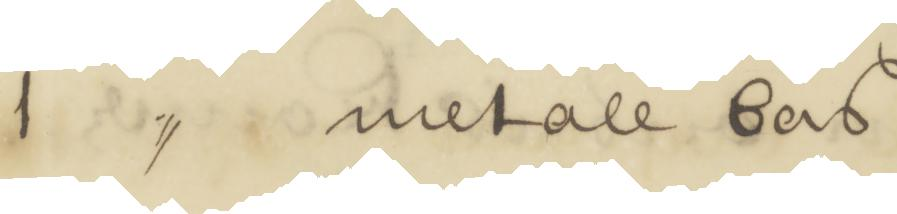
1 „ metale bas
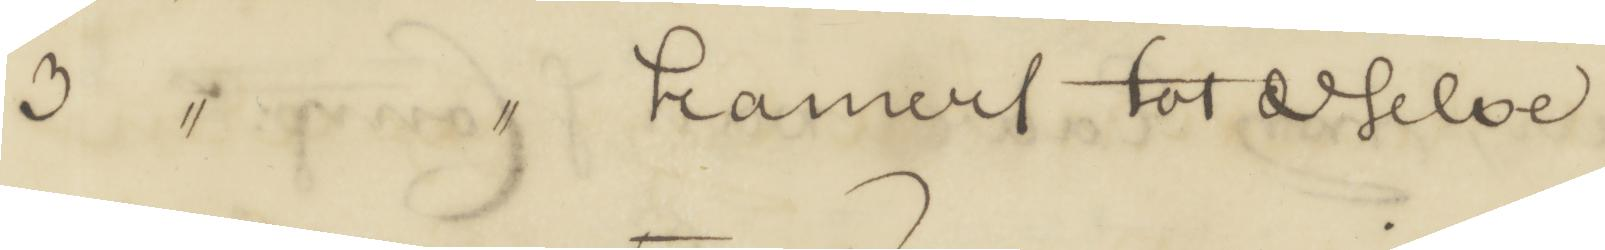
3 „ „ kamers tot deselve
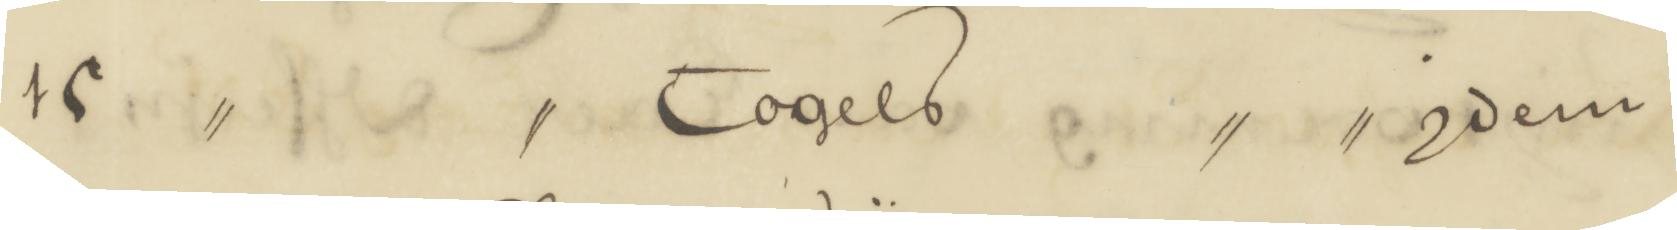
15 „ „ Cogels „ „ jdem
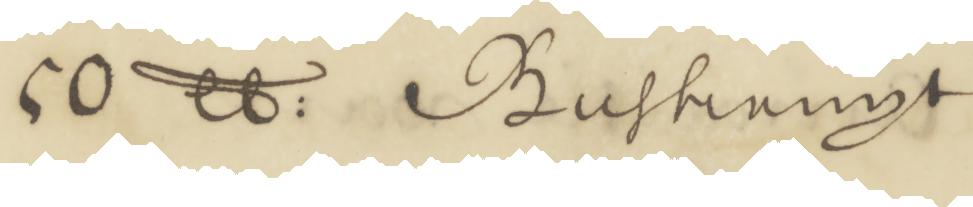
50 lb: Buskruijt
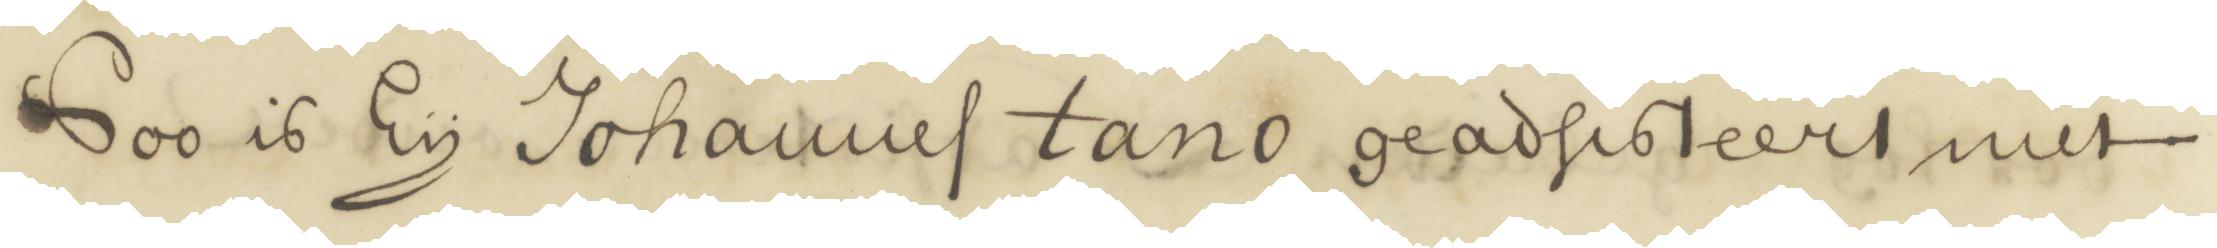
soo is hij Johannes tano geadsisteert met
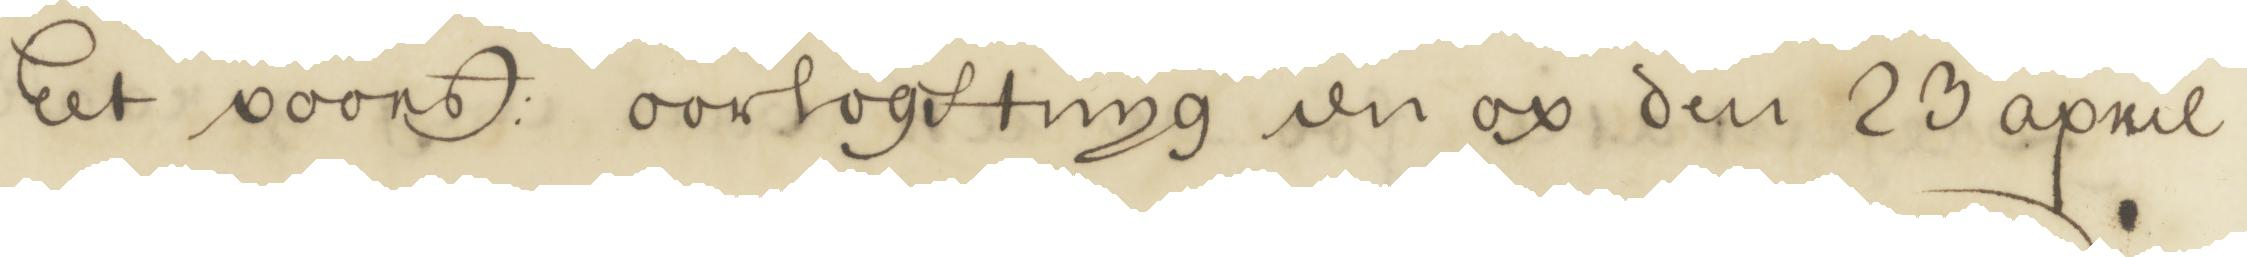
het voors: oorlogstuijg en op den 23 april
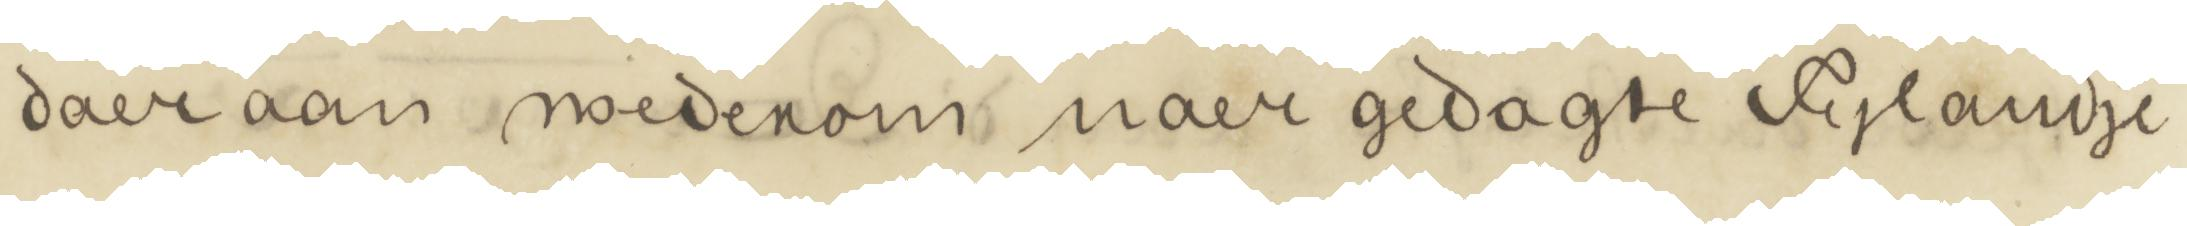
daer aan wederom naer gedagte Eijlandje
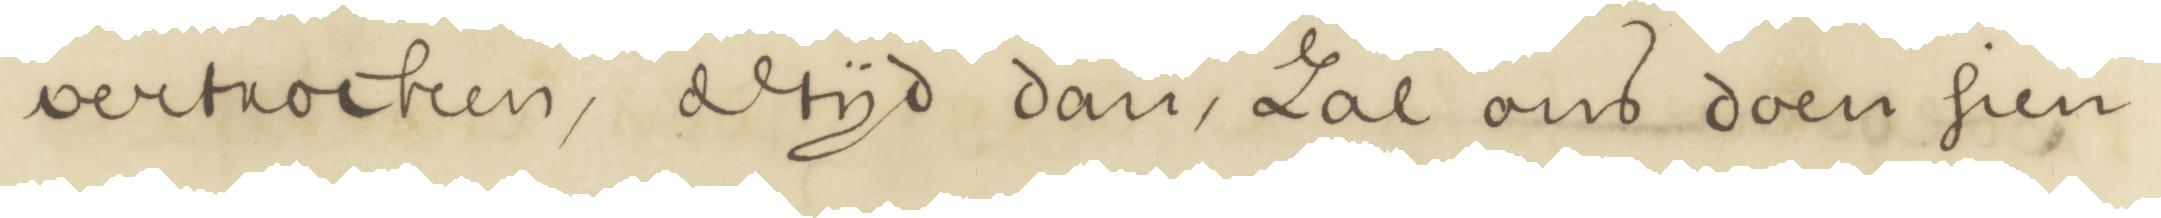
vertrocken, de tijd dan, zal ons doen sien
